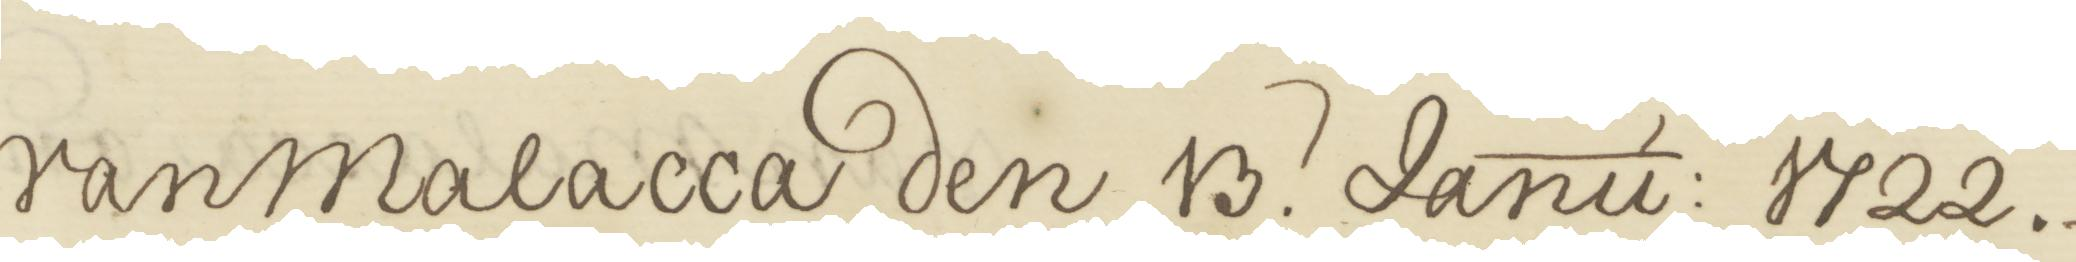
van malacca den 13.' Janu: 1722.
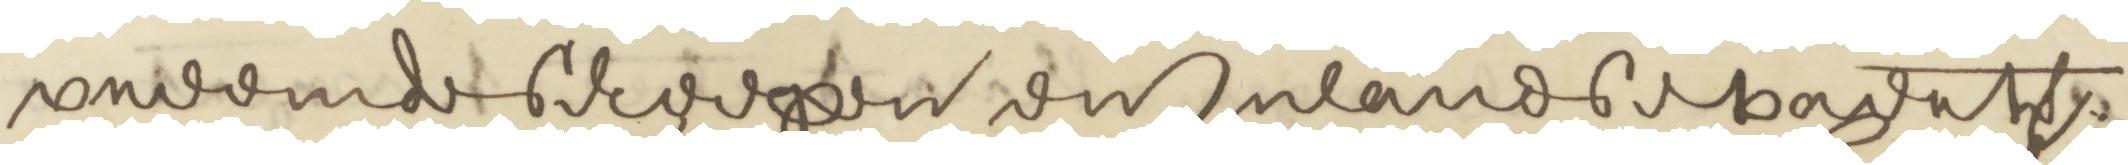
vreemde scheepen en jnlandse vaertver.
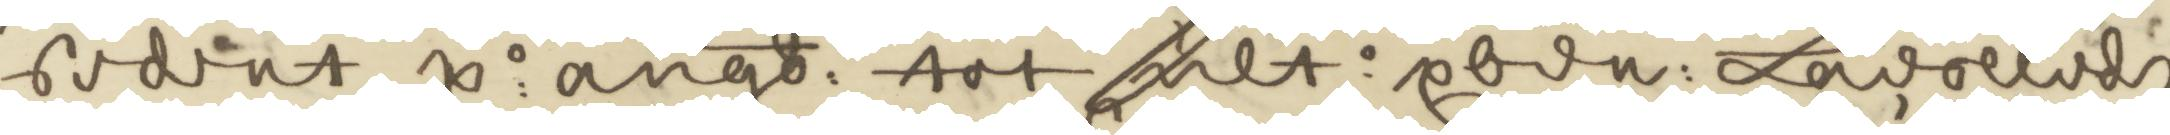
sedert p:o augo: tot ult:o xber: laestleden
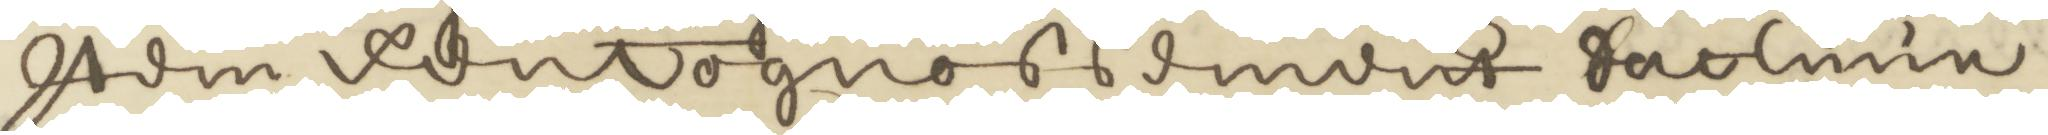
jtem Een Cognosement factuur
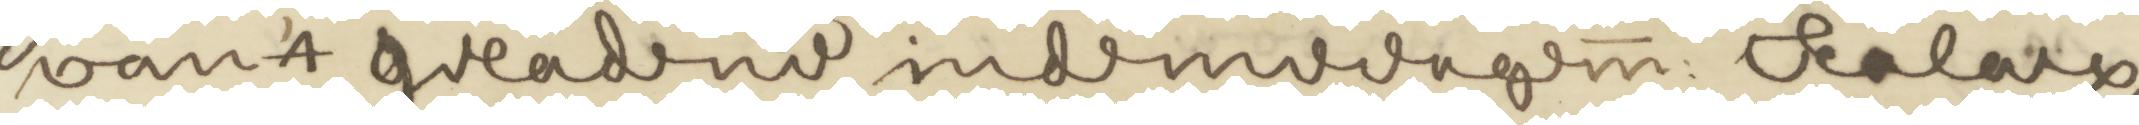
van ’t geladene in de meergem: Chaloup
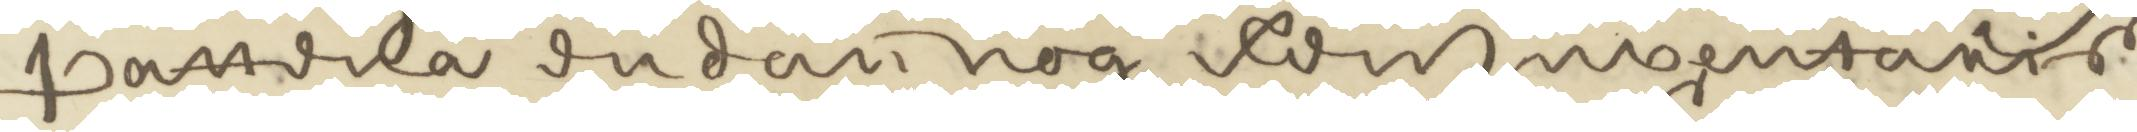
pattena en dan nog Een jnventaris
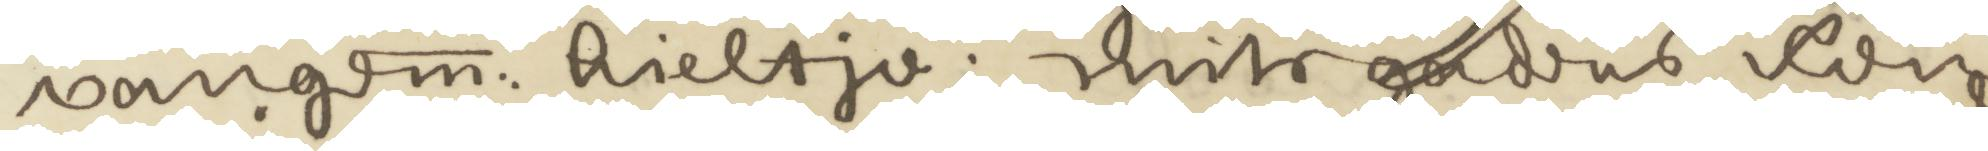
van gem: kieltje; mitsgaders Een
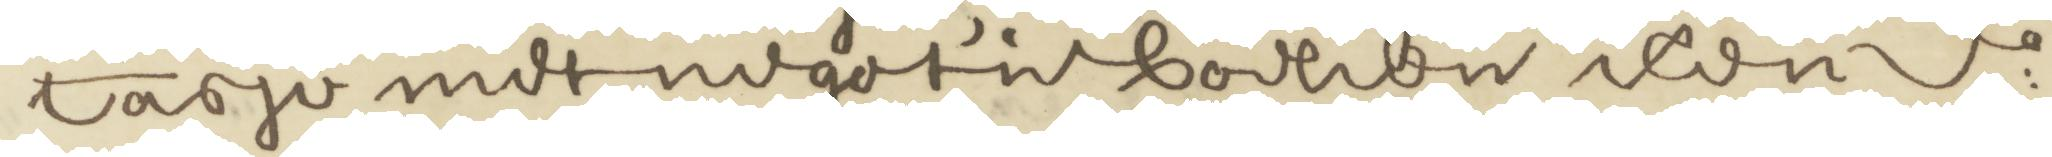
Casje met negotieboeken Een _:o
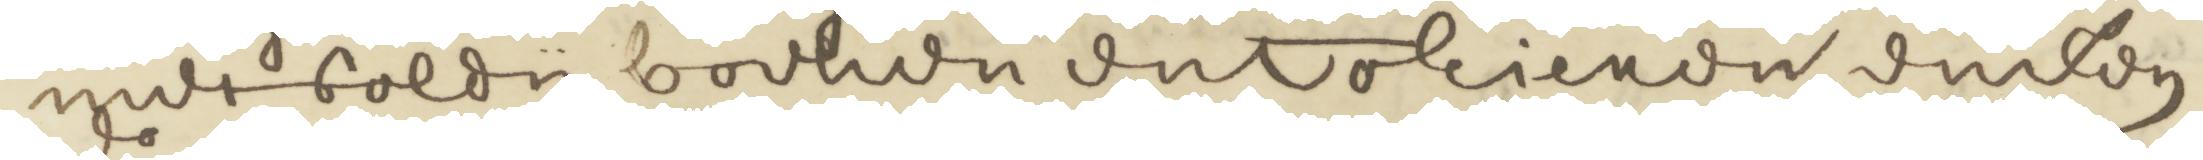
met soldij boeken en Cohieren en Een
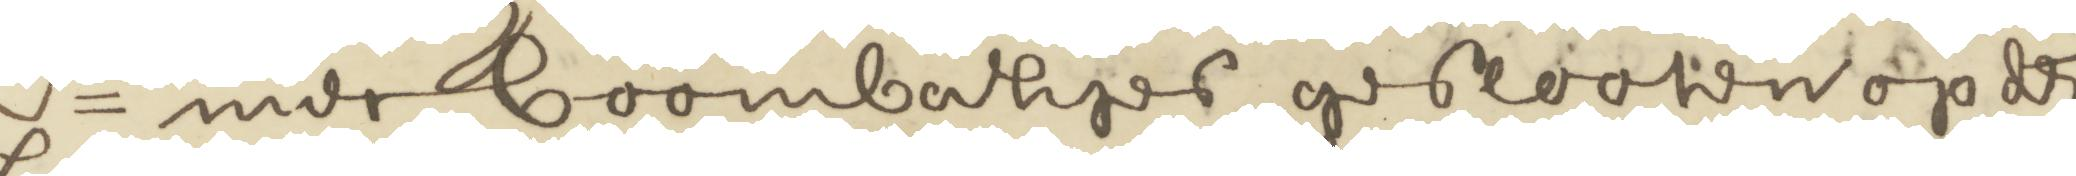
_=o met boomboekjes geslooten op den
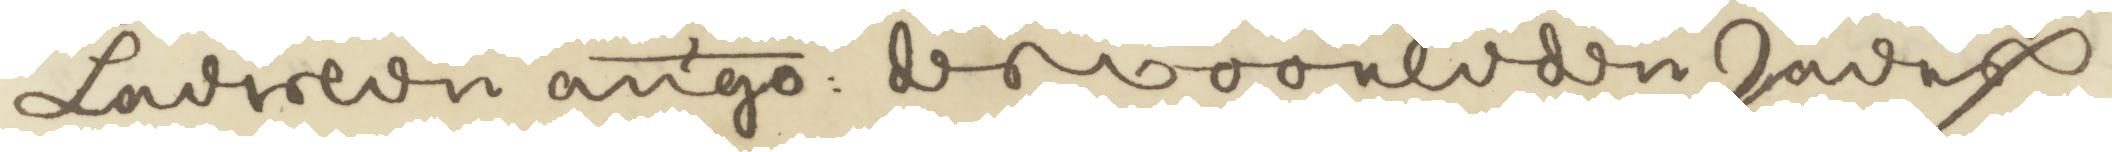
laetsten augo: des voorledenjaers
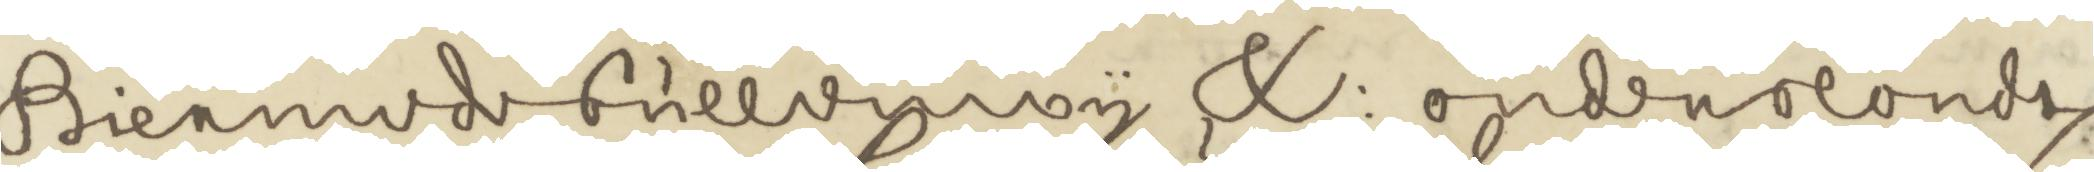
Hiermede sullen wij &: onderstondt,
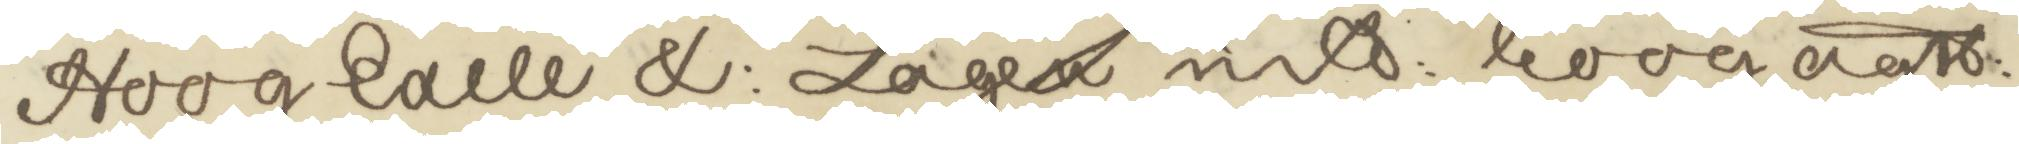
Hoog Edele &: lager uEd: hoog agtb:
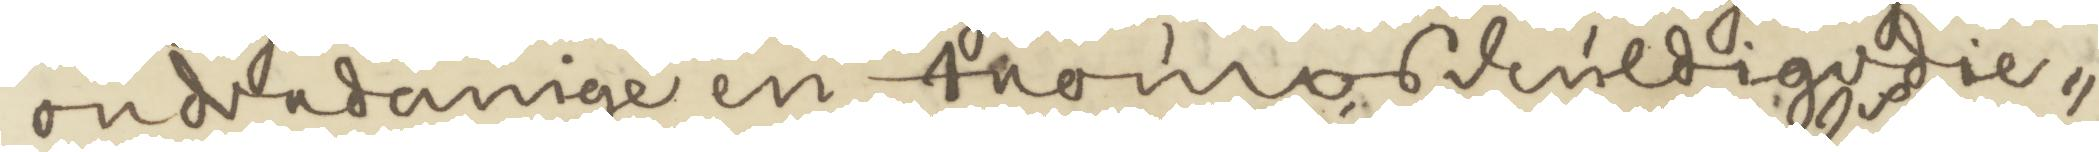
onderdanige en trouwschuldige die„
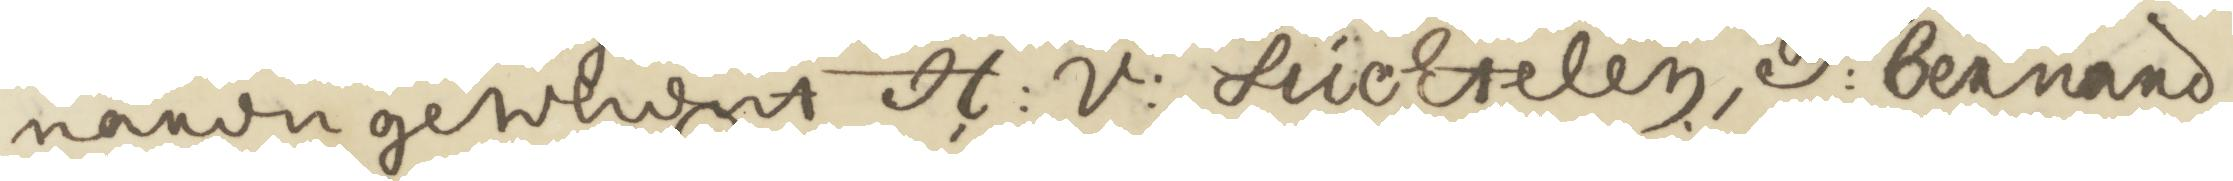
naren getekent H: v: suchtelen, J:s bernard
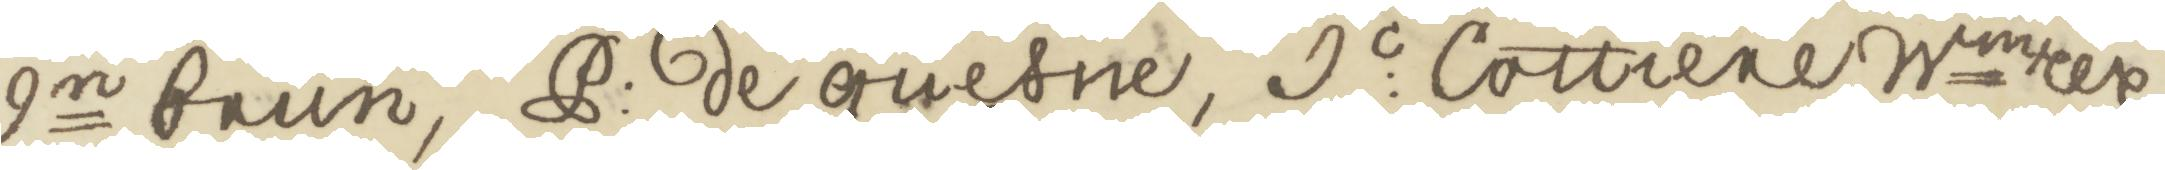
J=n brun, P: de quedue, J:c Cottiere, W=m rex
